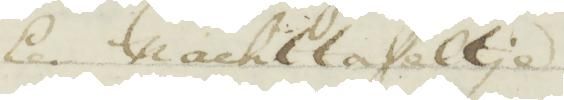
Een Nachttafeltje
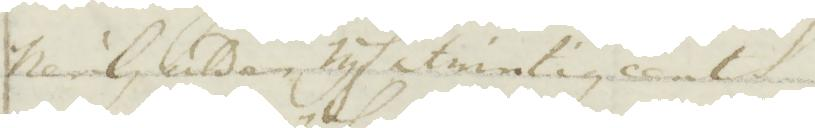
vier Gulden vijf en twintig cents
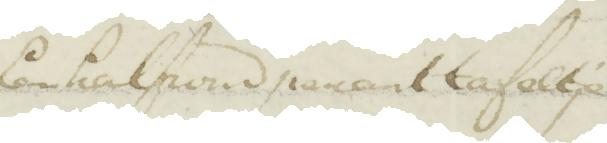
Een halfrond penanttafeltje
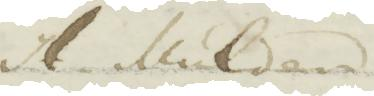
H. Mulder
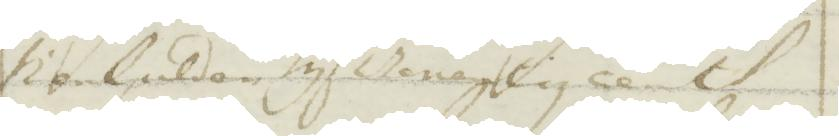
vier Gulden vijf en zeventig cents
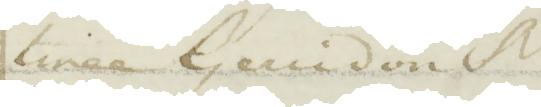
twee Gerridons
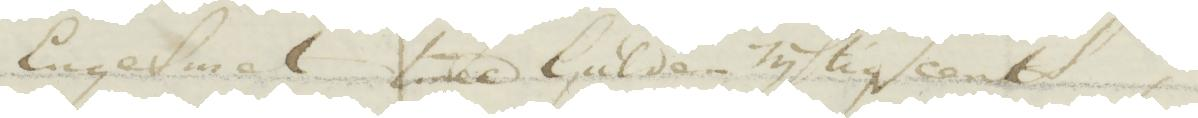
Engelsmet twee Gulden vijftig cents
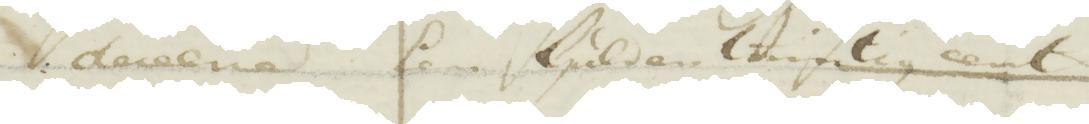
dezelve Een Gulden twintig cents
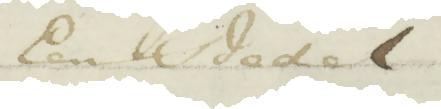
Een Sadel
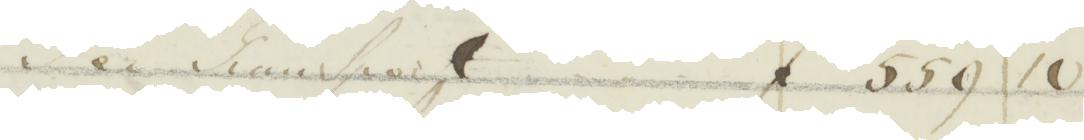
Per Transport ƒ 559 10
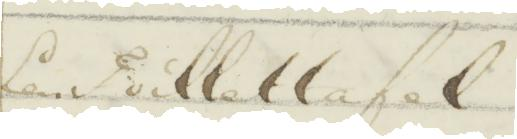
Een Toillettafel
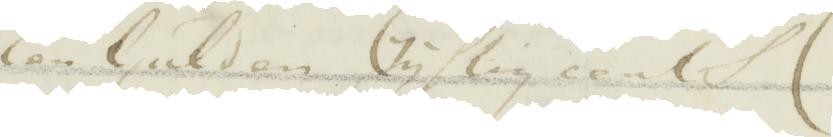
Een Gulden vijftig cents
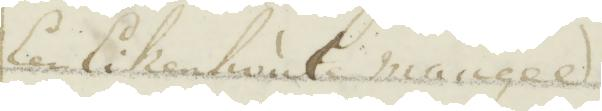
Een Eikenhoute mangel
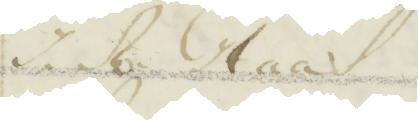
J van Haas
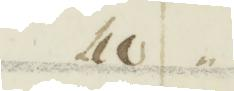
40 „
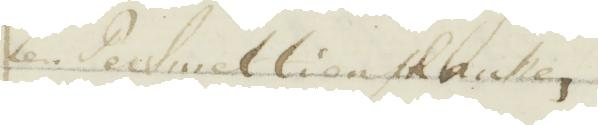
Een Pelmet tien planken
